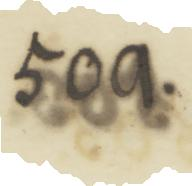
504.
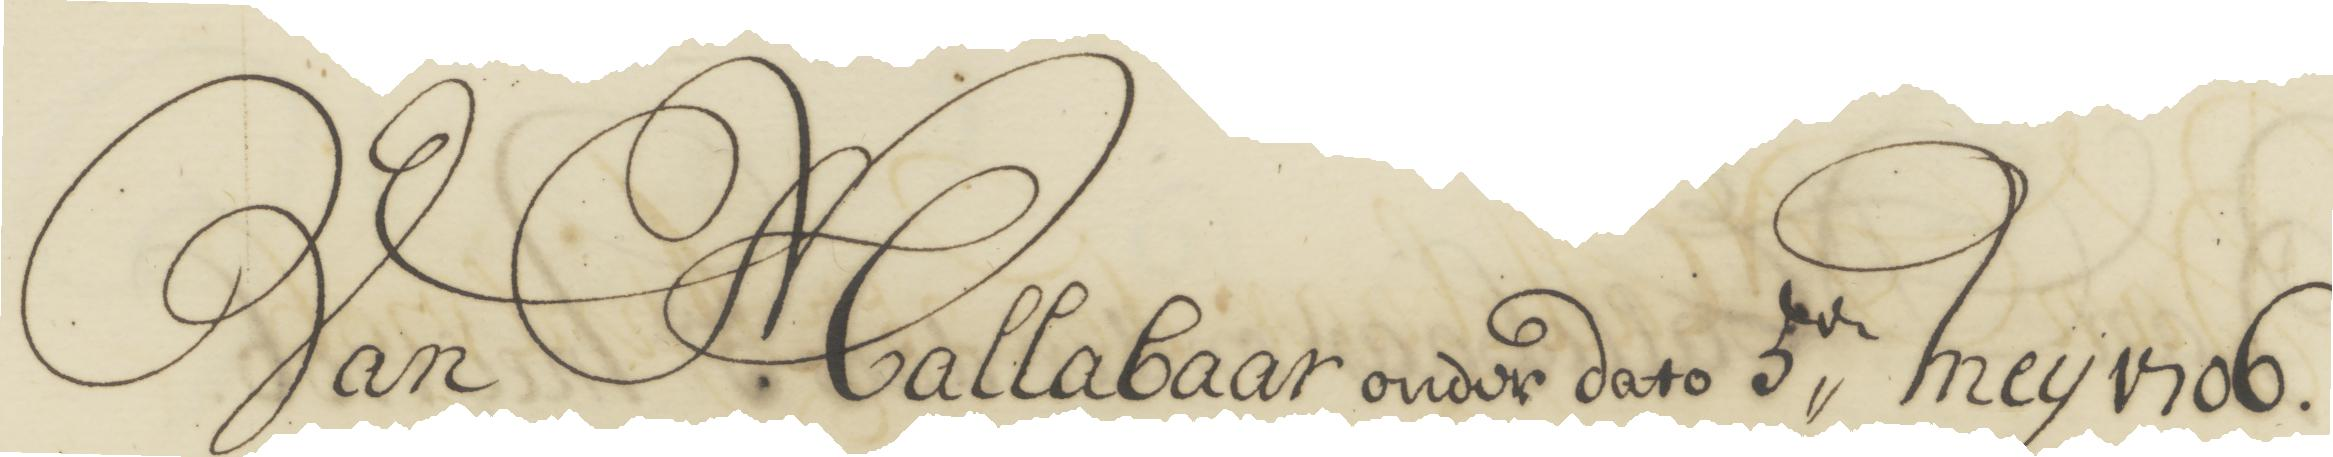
Van Mallabaar onder dato 5„en Meij 1706.
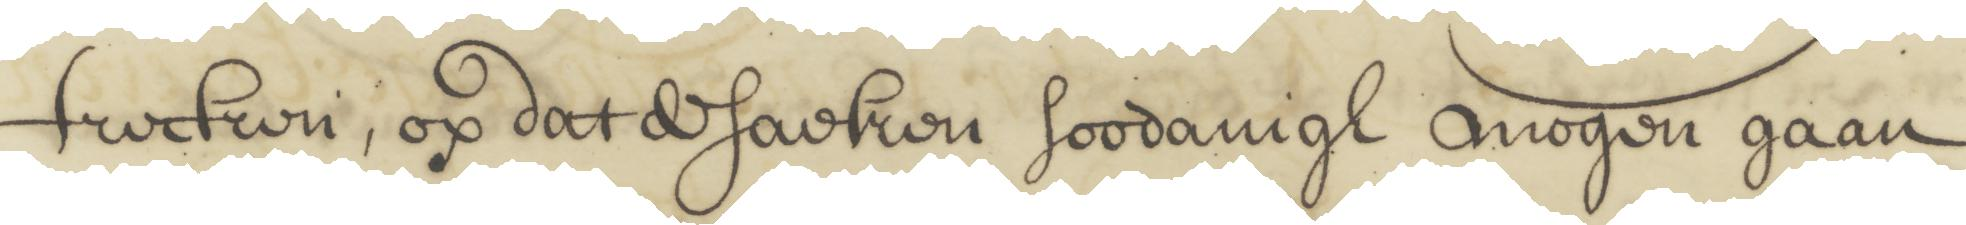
trecken, op dat de saeken soodanigh mogen gaan
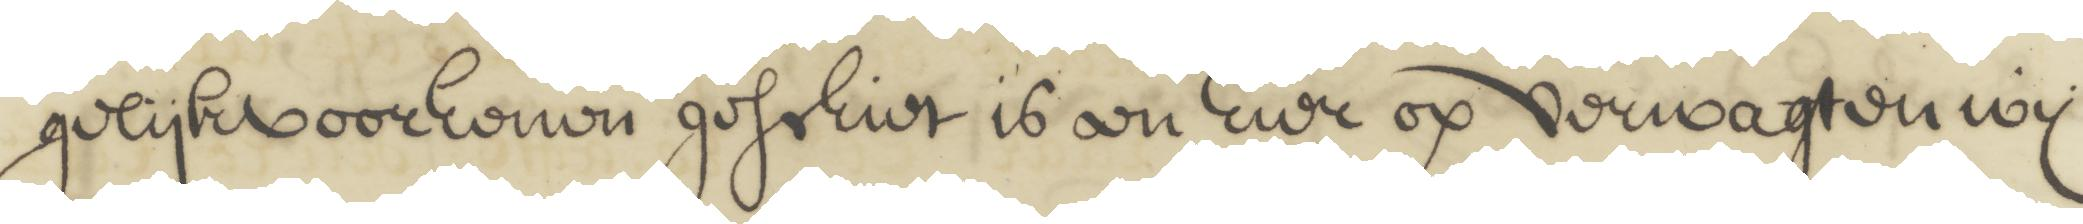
gelijk voorhenen geschiet is een hier op verwagten wij
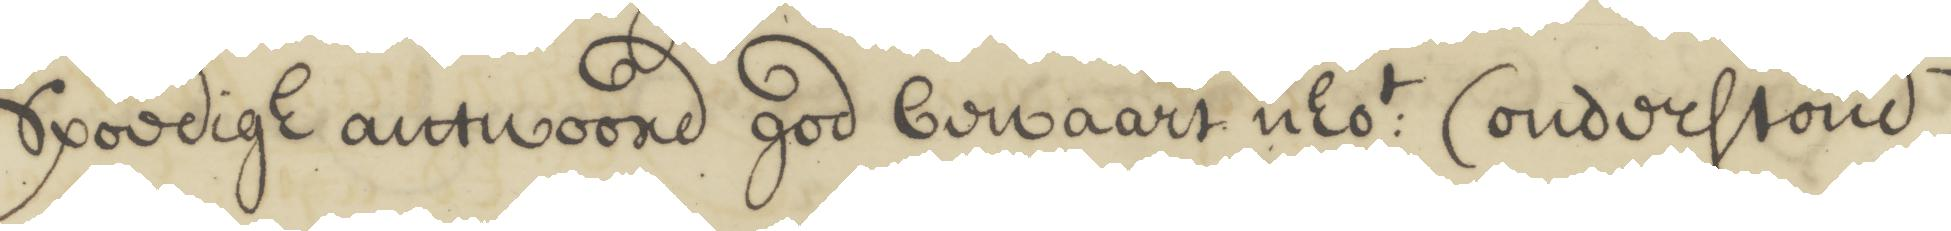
spoedigh antwoord god bewaart uho:t (onderstond
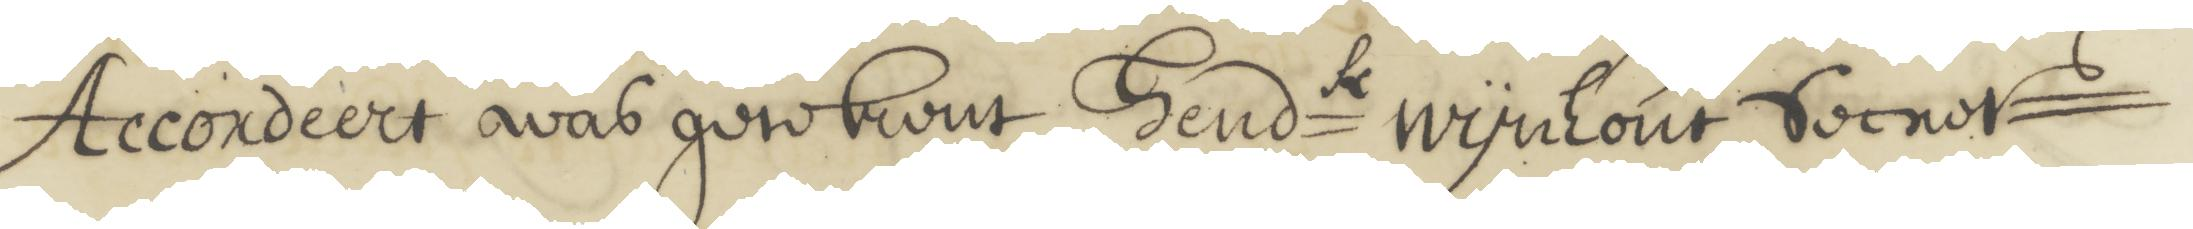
Accordeert was getekent Hend=k wijnhout secret=s
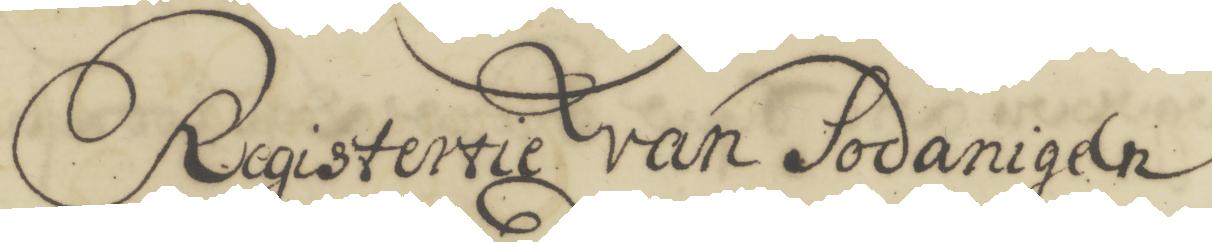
Registertie van Sodanigen
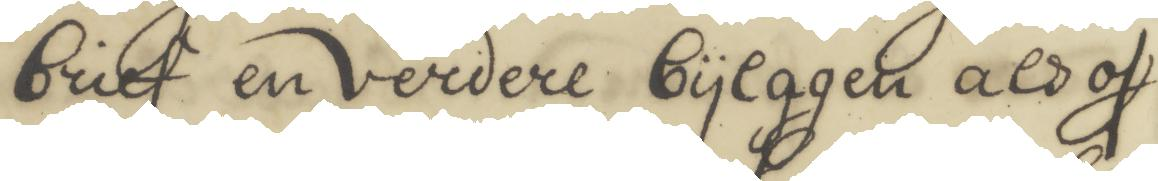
brief en verdere bijlagen als op
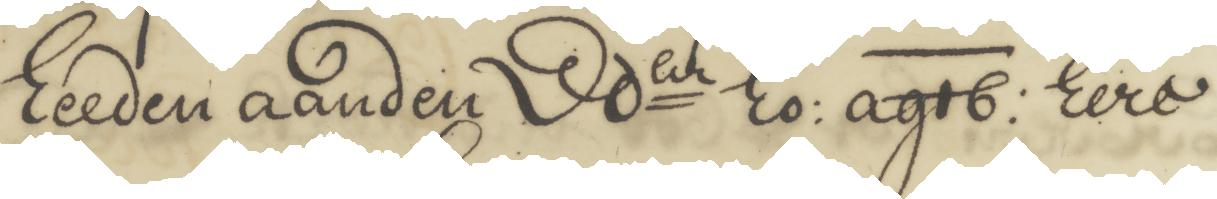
heeden aanden Ed=len ho: agtb: here
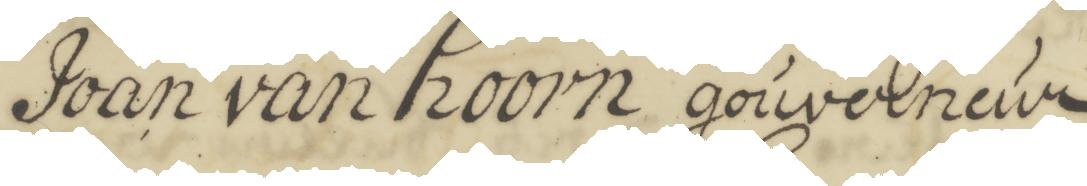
Ioan van hoorn gouverneur
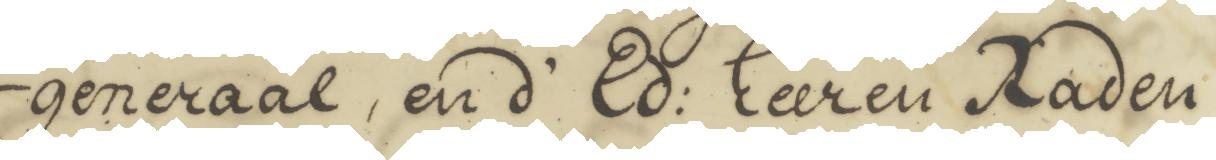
generaal, en d’ Ed: heeren Raden
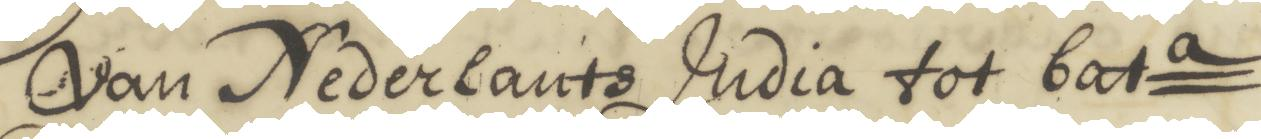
van Nederlants Jndia tot bat=a
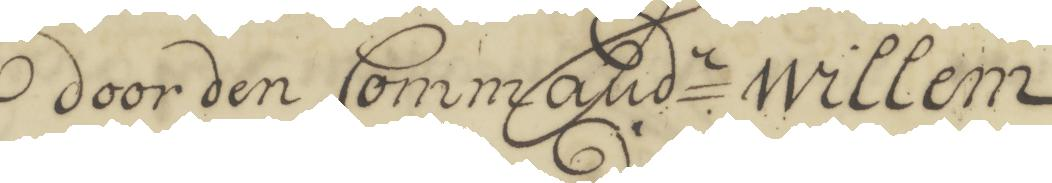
door den Command=r Willem
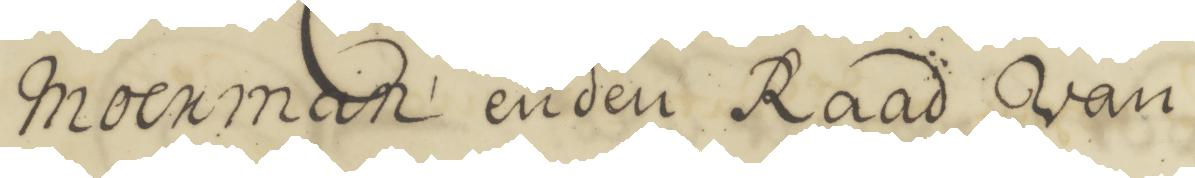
moerman en den Raad van
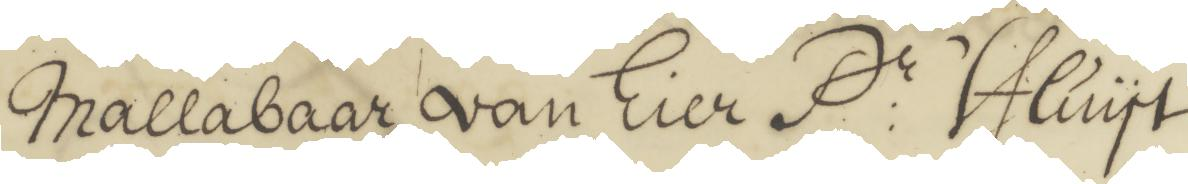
Mallabaar van hier P:r 'tfluijt
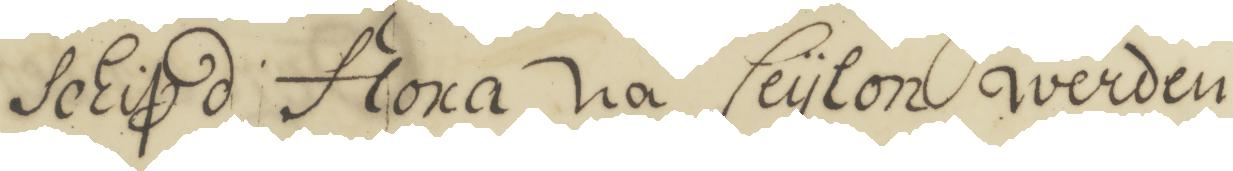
schip d’ stora na Ceijlon werden
